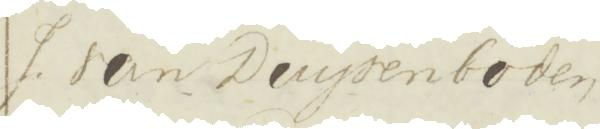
J. van Duyvenboden
